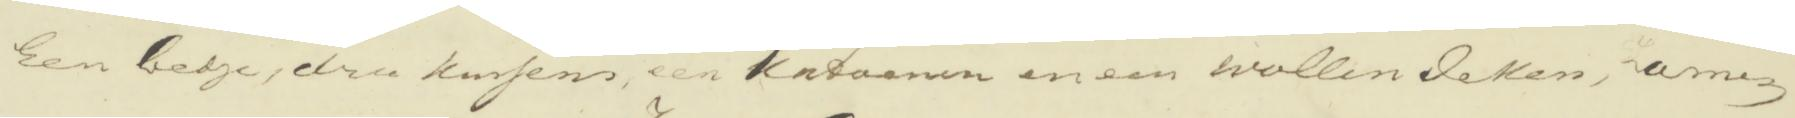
Een bedje, drie kussens, een katoenen en een wollen deken, Zamen
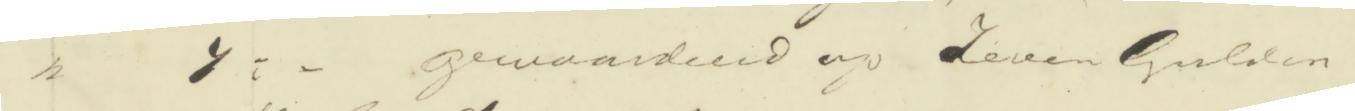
„ 7: — gewaardeerd op Zeven Gulden
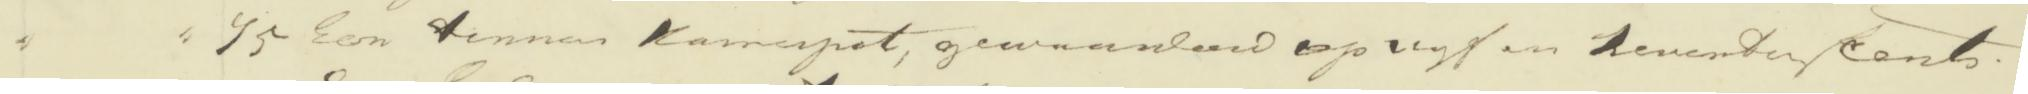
„ 75 Een tinnen Kamerpot, gewaardeerd op vyf en Zeventig Cents.
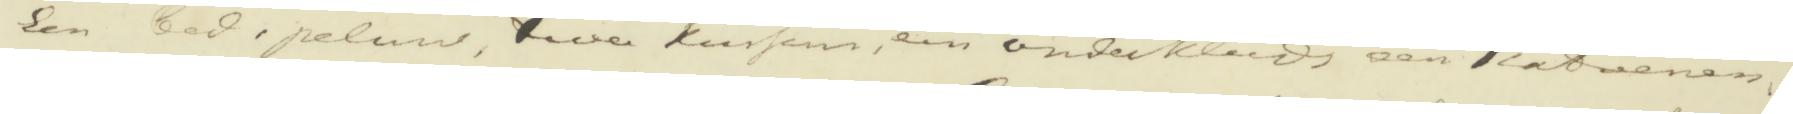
Een bed, peluw, twee kussens, een onderkleed een katoenen,
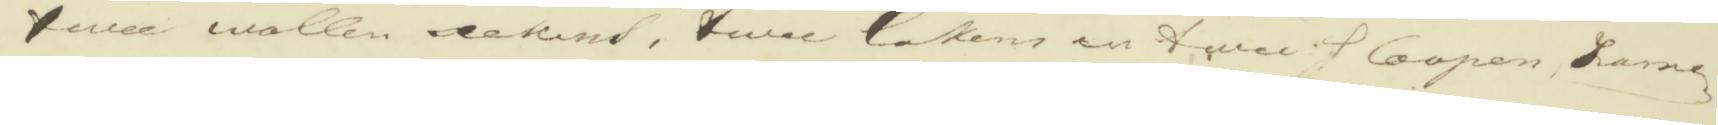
twee wollen dekens, twee lakens en twee sloopen, Zamen
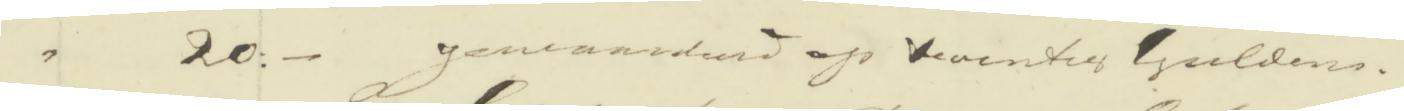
„ 20: — gewaardeerd op twintig Guldens.
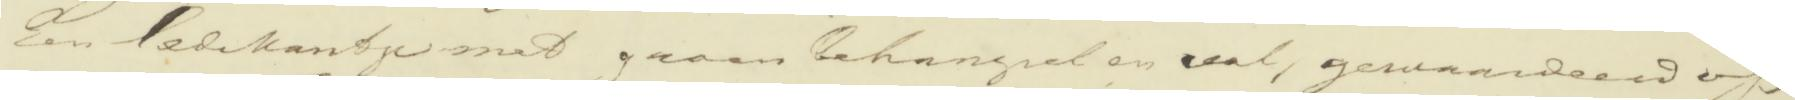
Een Ledikantje met groen behangsel en val, gewaardeerd op
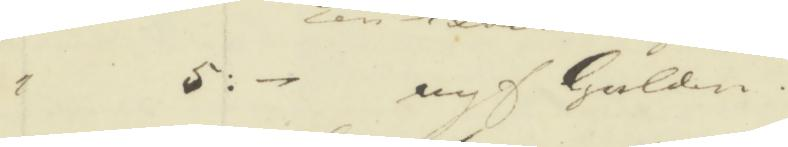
„ 5: — vyf Gulden.
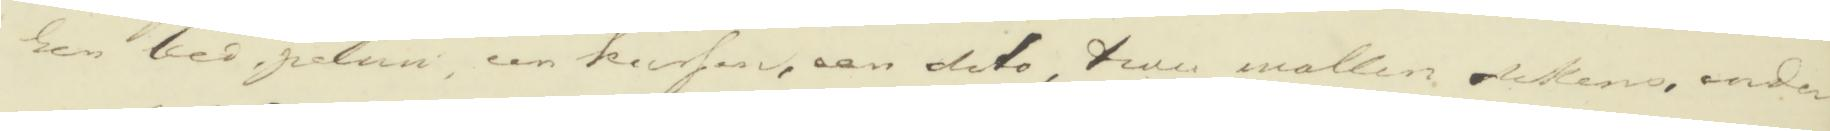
Een bed, peluw, een kussen, een dito, twee wollen dekens, onder
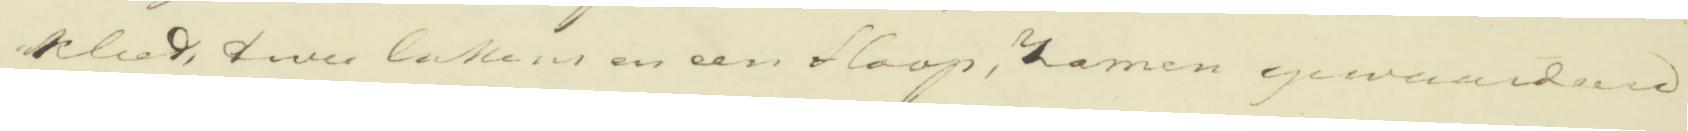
kleed, twee lakens en een sloop, zamen gewaardeerd
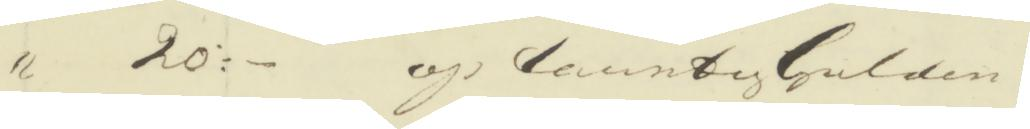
„ 20:— op twintig Gulden.
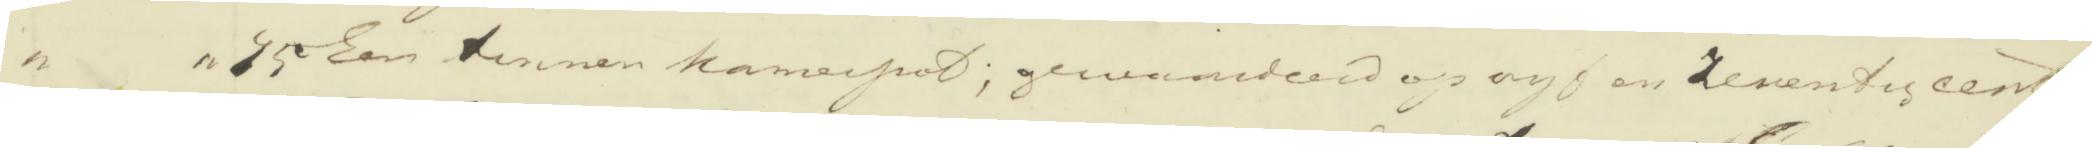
„ „ 75 Een binnen kamerpot, gewaardeerd op vyf en Zeventig cents
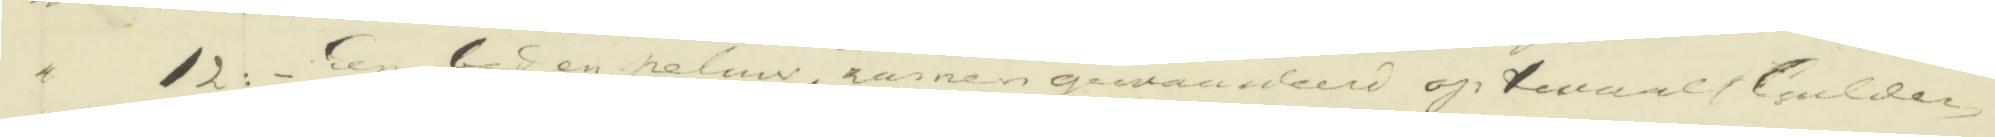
„ 12: — Een bed en peluw, zamen gewaardeerd op twaalf Gulden
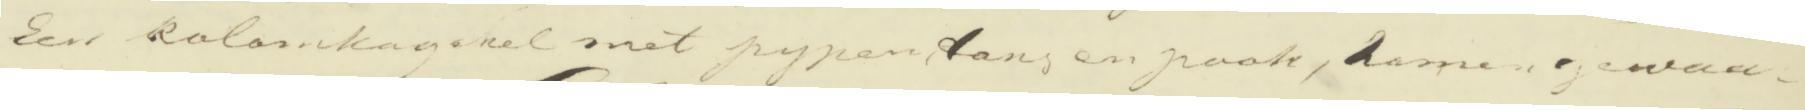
Een kolemkagchel met pypen, tang en pook, zamen gewaa„
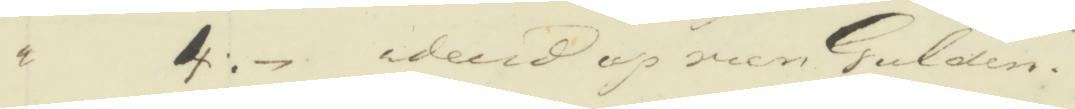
4:—. rdeerd op vier Gulden.
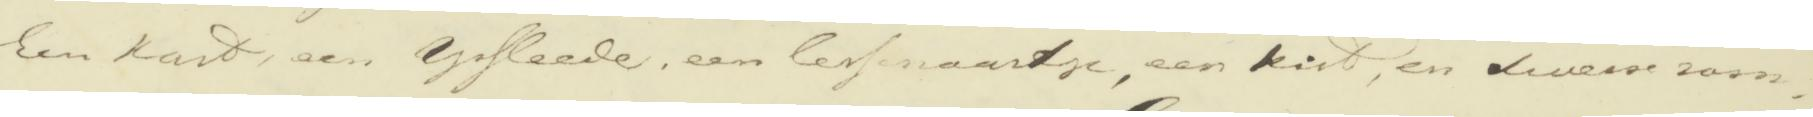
Een kast, een Yssleede, een lessenaartje, een kist, en diverse rom,
